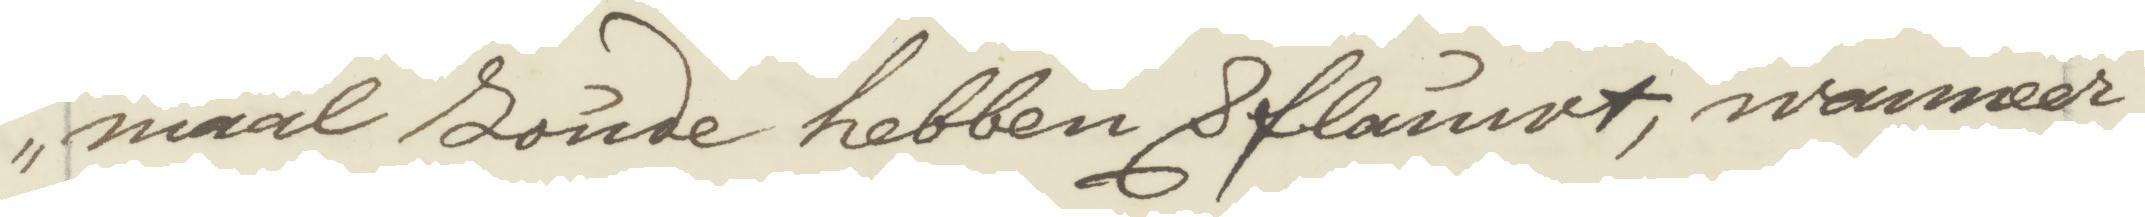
„maal zoude hebben verflauwt, wanneer
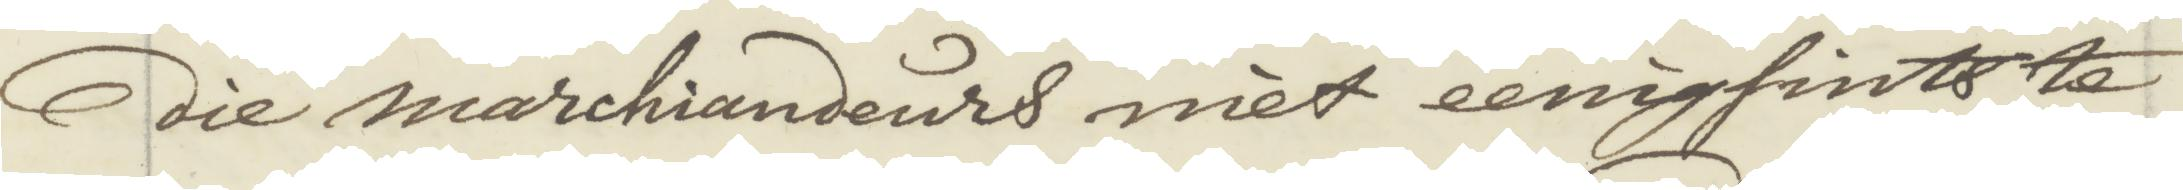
die marchiandeurs niet eenigsints te
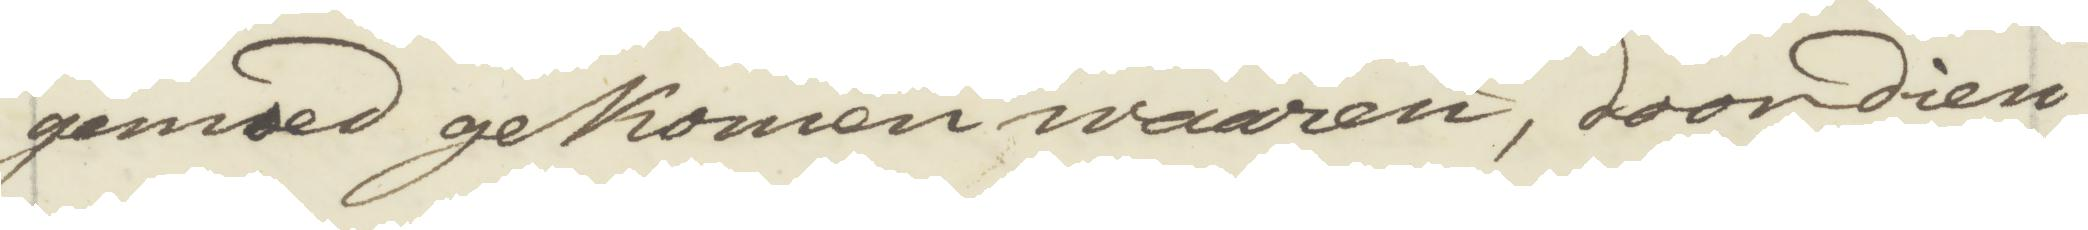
gemoed gekomen waaren, door dien
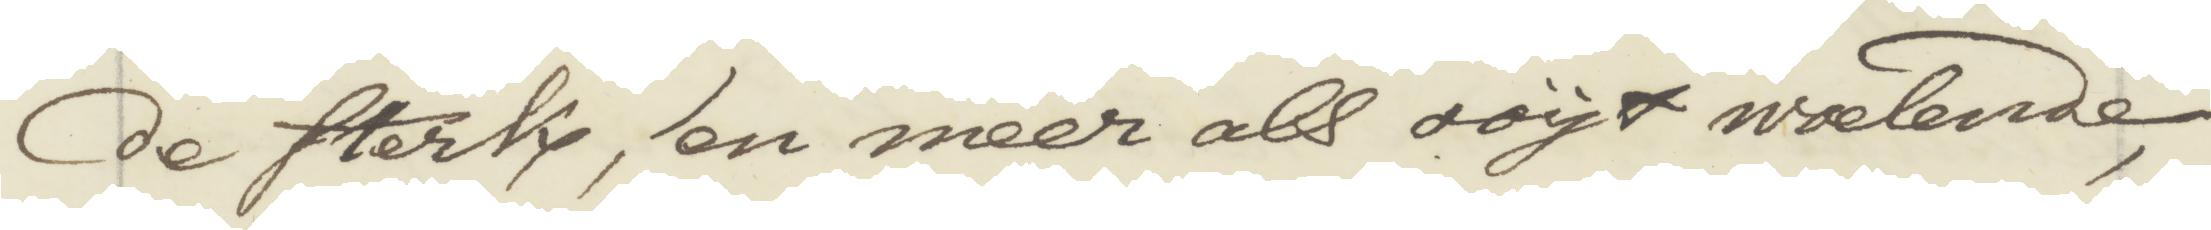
de sterk, 'en meer als ooijt woelende,
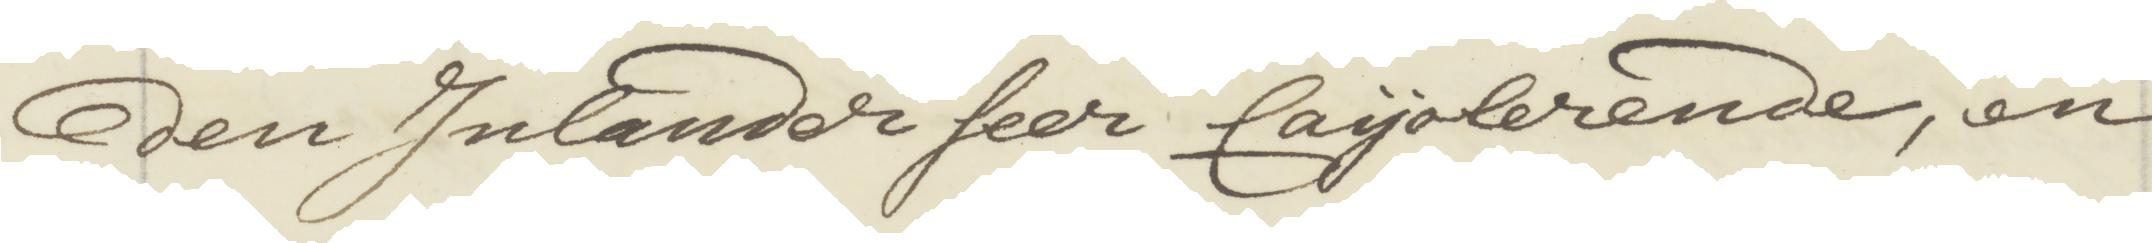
den Jnlander seer Caijolerende, en
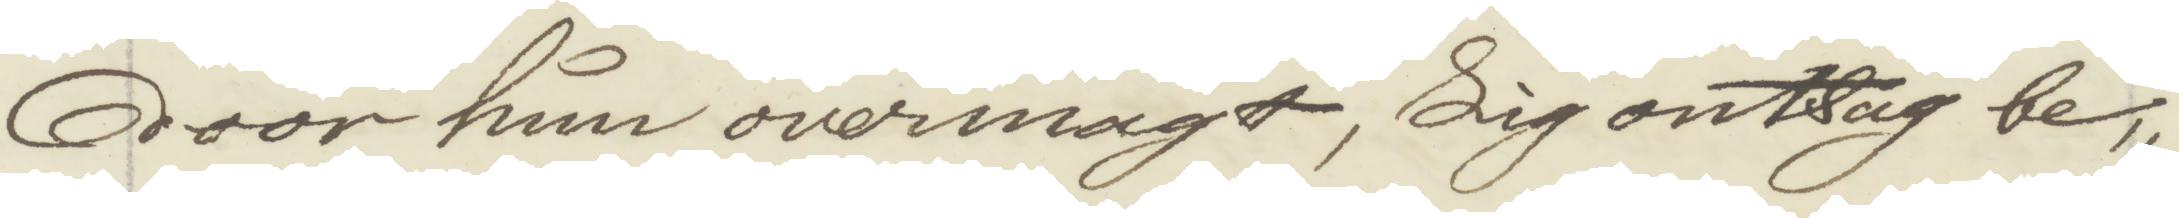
door hun overmagt, zig ontsag be„
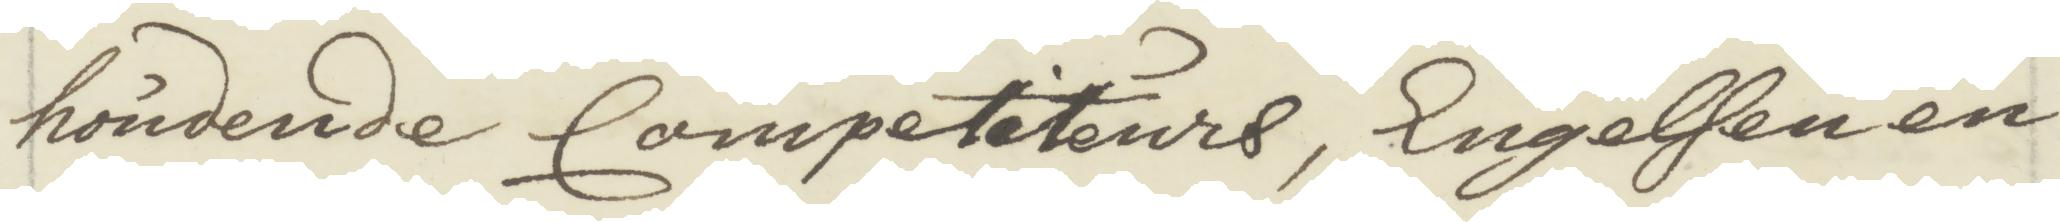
houdende Competiteurs, Engelsen en
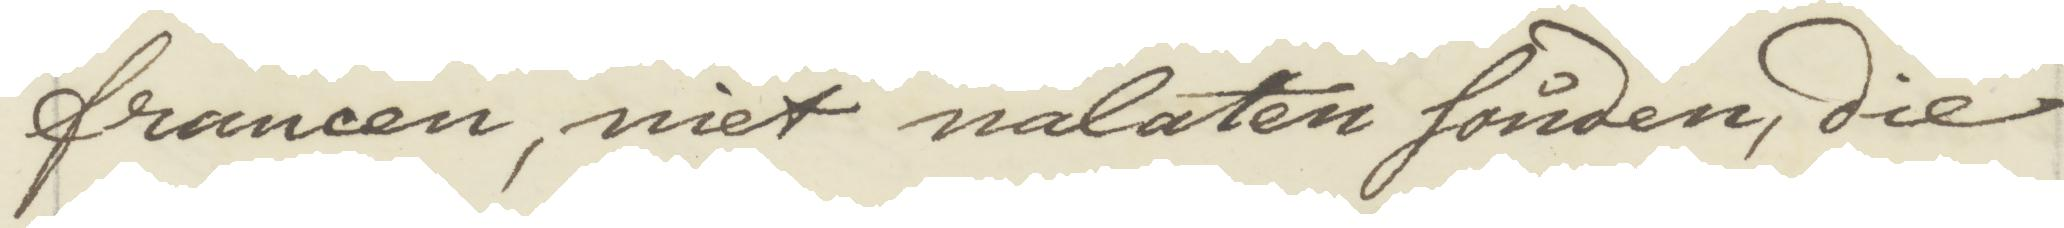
francen, niet nalaten souden, die
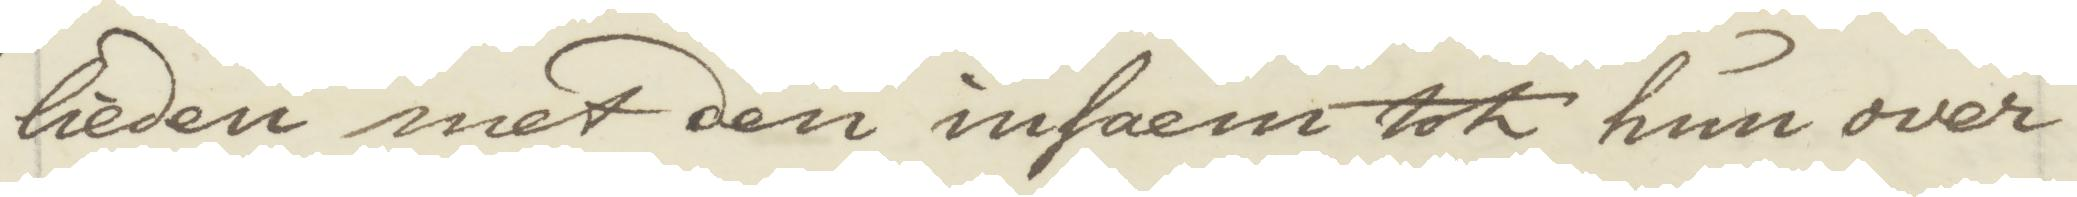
lieden met den insaem tot hun over
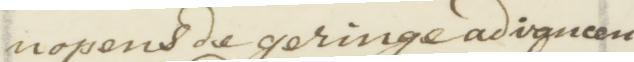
nopens de geringe advancen
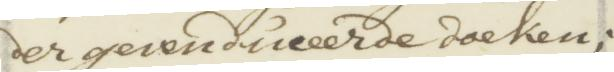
der gevenduceerde doeken;
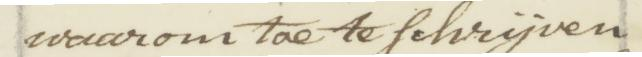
waarom toe te schrijven
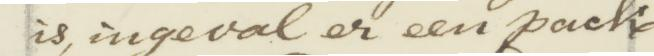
is, ingeval er een pack
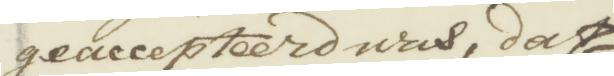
geaccepteerd was, dat
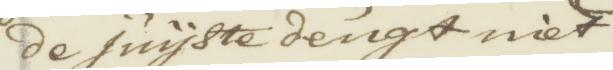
de juijste deugt niet
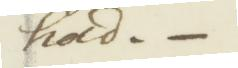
had. —
